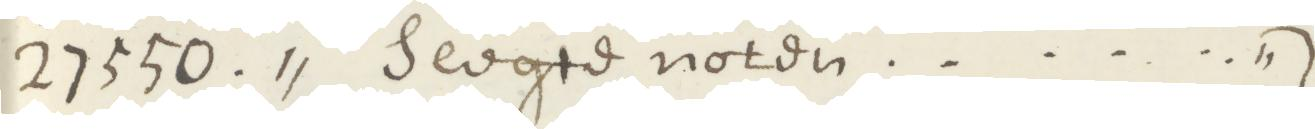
27550. „ slegte noten . . . . . . „
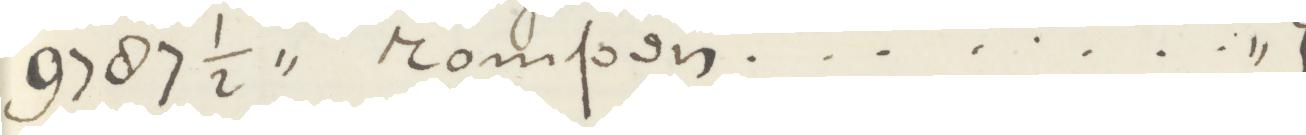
9787½ „ rompen . . . . . . . . „
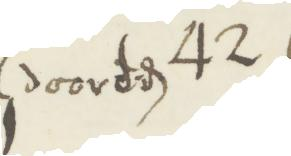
door den 42
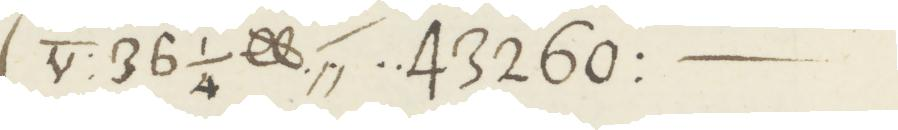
v: 36¼ lb. „. . . 43260: —
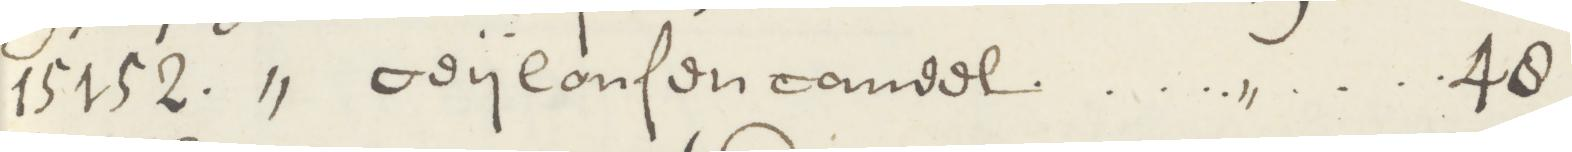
15152. „ ceijlonsen caneel . . . . . „ . . . . 48
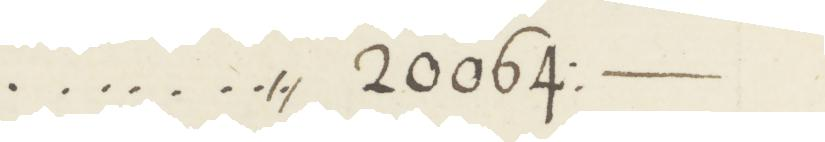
. . . . . . . .„ 20064: —
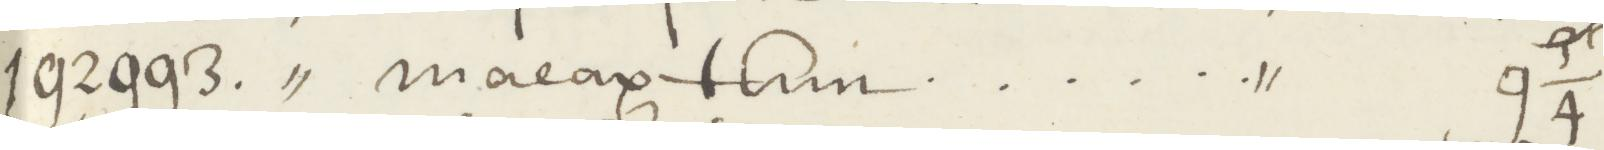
192993. „ malax thin . . . . . . „ 9¾
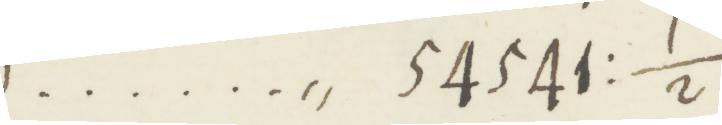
. . . . . . „ 54541:½
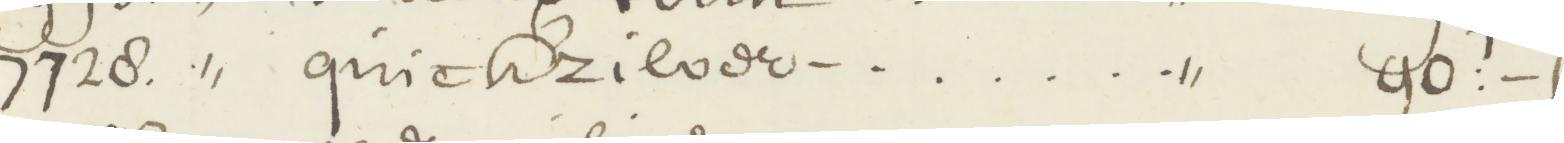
7728. „ quickzilver - . . . . . . „ 90: —
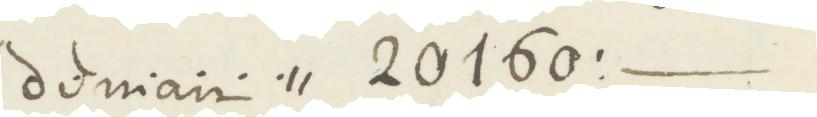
de man . .„ 20160: —
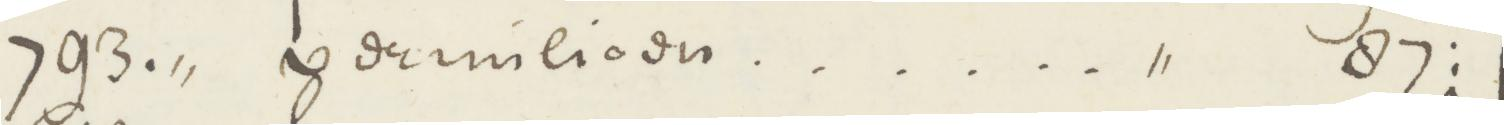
793. „ vermilioen . . . . . . „ 87:
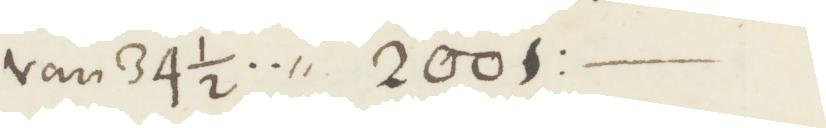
van 34½ . . „ 2001: —
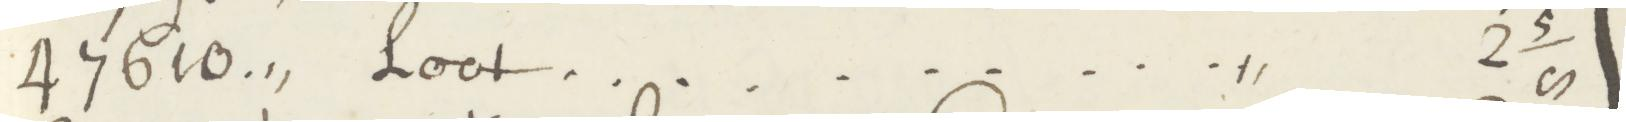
47610.„ Loot . . . . - - - - . . .„ 2 5/8
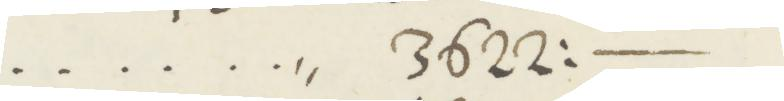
. . . . . . „ 3622: —
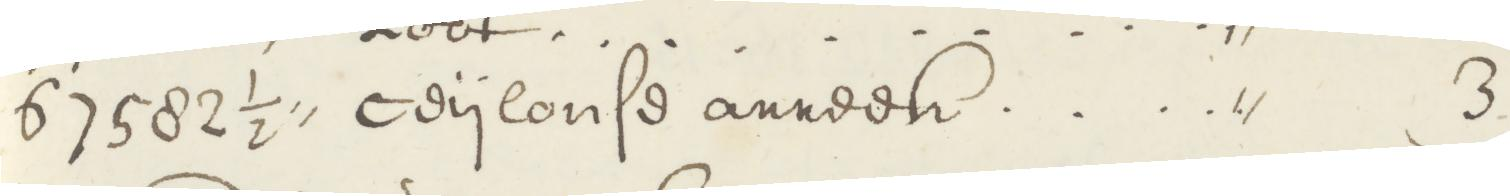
67582½„ Ceijlonse arreek . . . . .„ 3
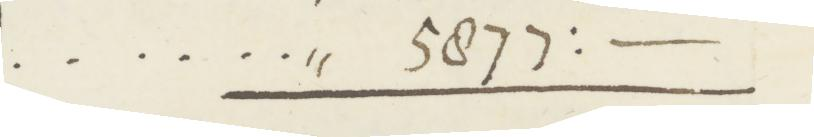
. - . . . . „ 5877: —
